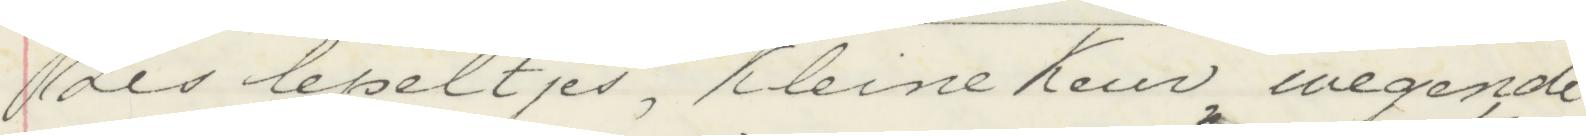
Zes lepeltjes, kleine keur, wegende
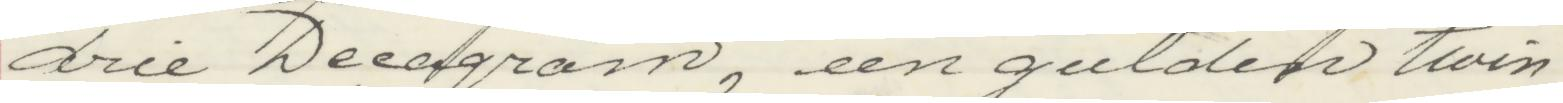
drie Decagram, een gulden twin
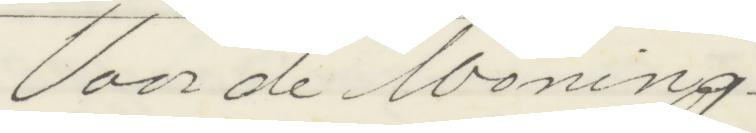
Voor de Woning
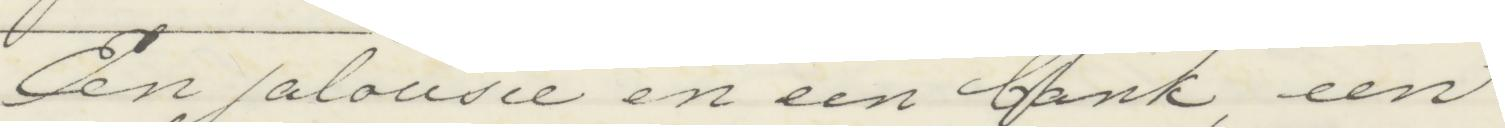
Een jalousie en een bank, een
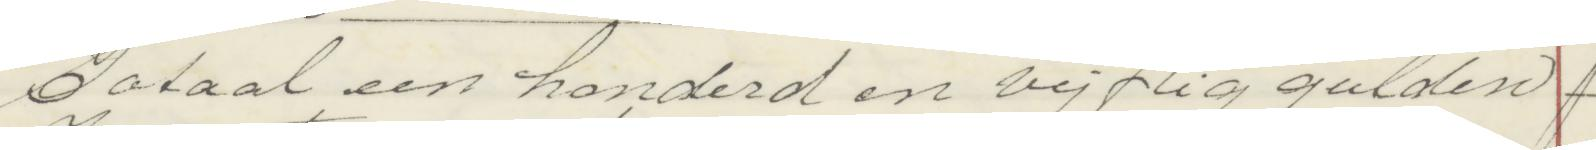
Totaal een honderd en vijftig gulden
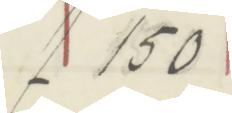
ƒ 150
